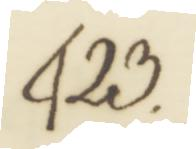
423.
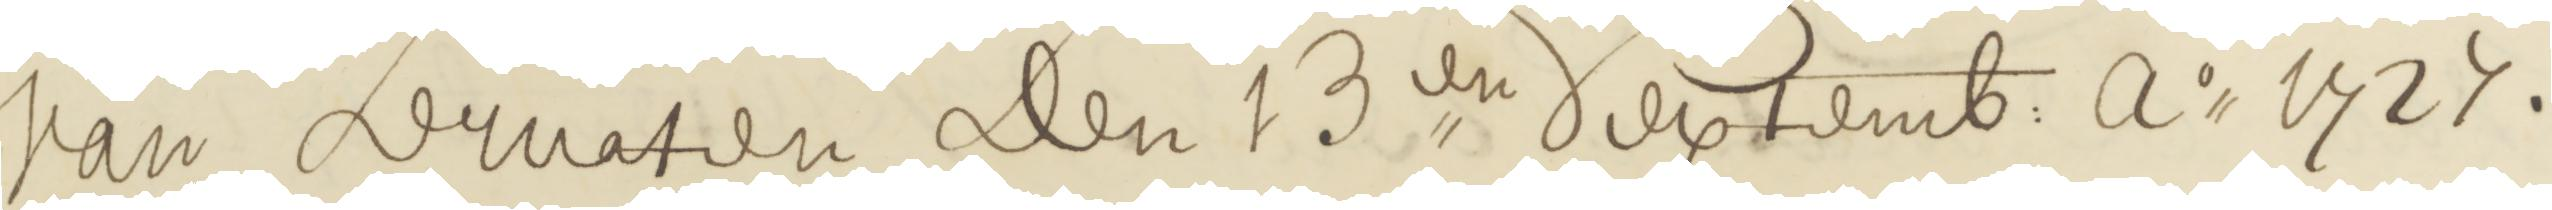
Van ternaten Den 13„en Septemb: A„o 1727.
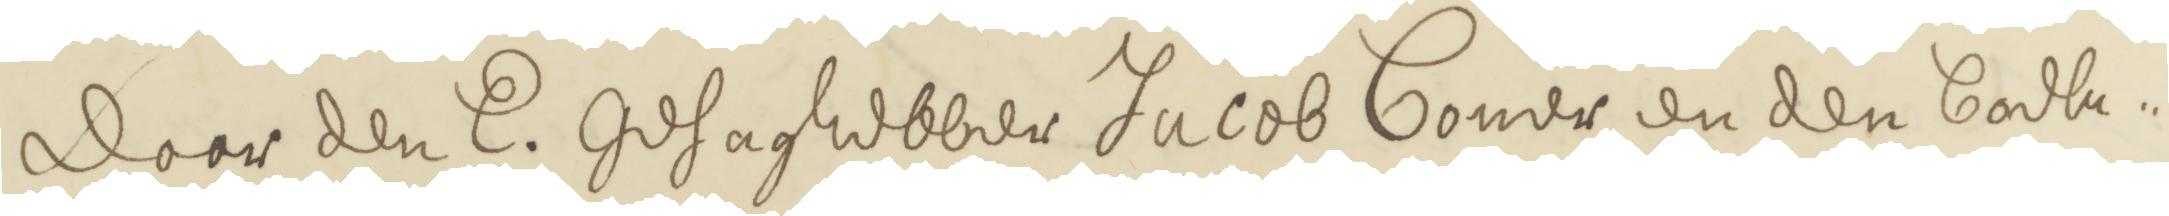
Door den E. Gesaghebber Jacob Boner en den boek„
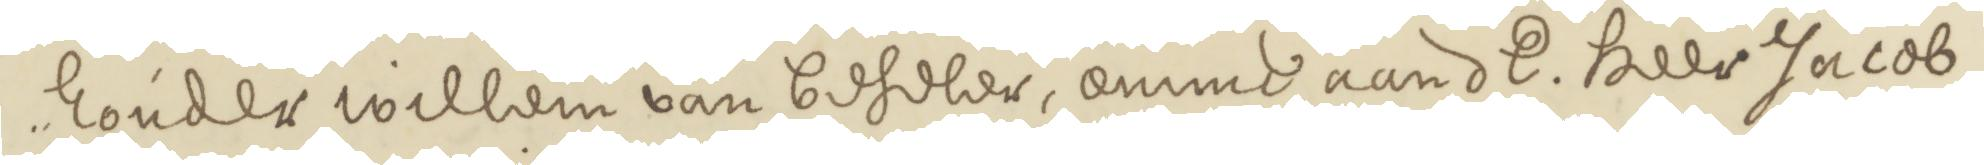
„houder willem van beseler, omme aan d E. heer Jacob
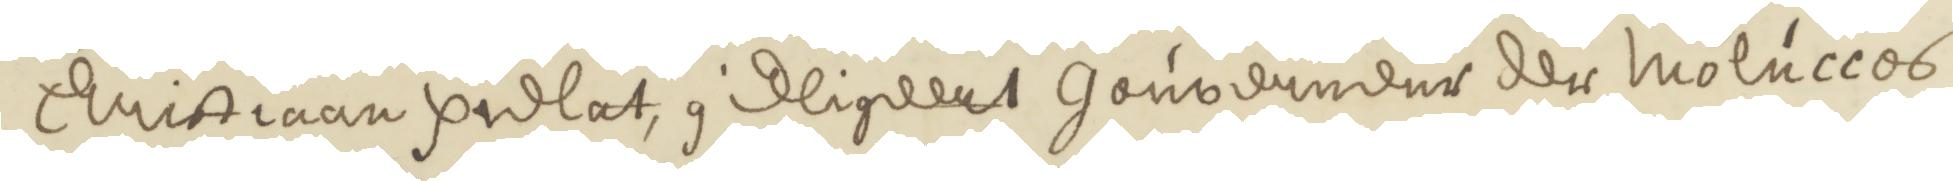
Christiaan pielat, g’Eligeert gouverneur der Moluccos
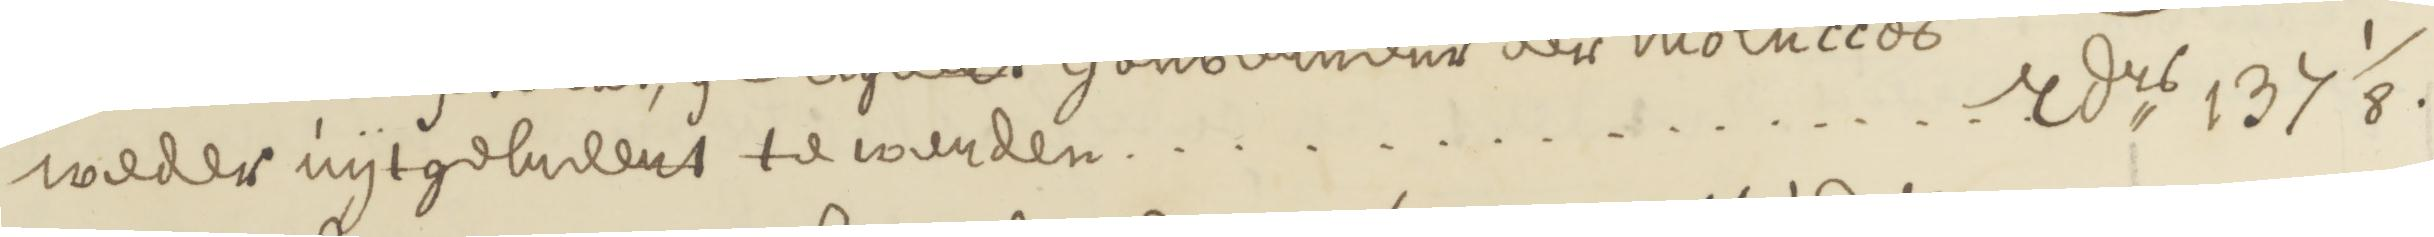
weder uijtgekeert te werden . . . . . . . . . . . . . . . . . rd„rs 137 1/8.
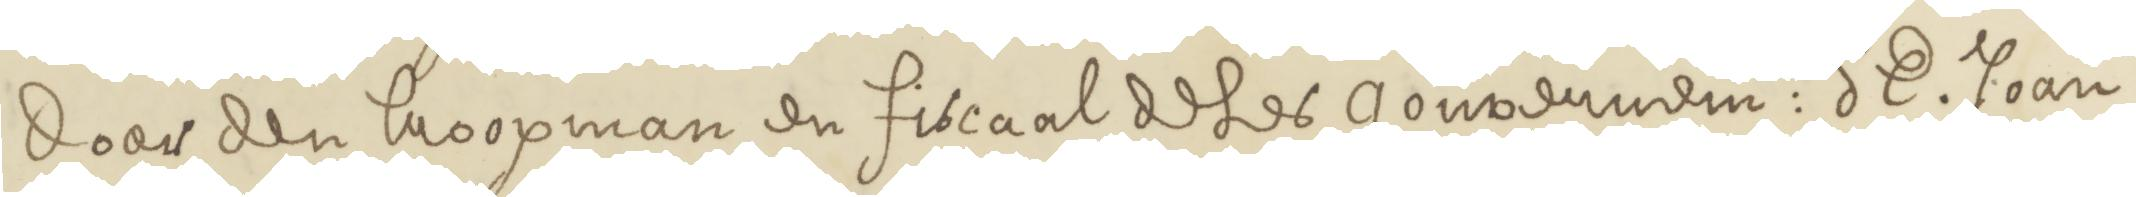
door den koopman en fiscaal deses gouvernem:ts d' E. Joan
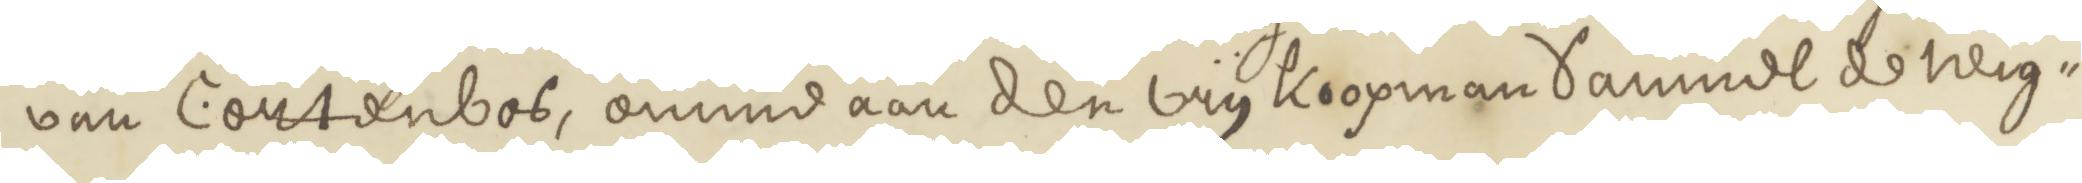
van Cortenbos, omme aan den vrij Koopman Samuel de Wig„
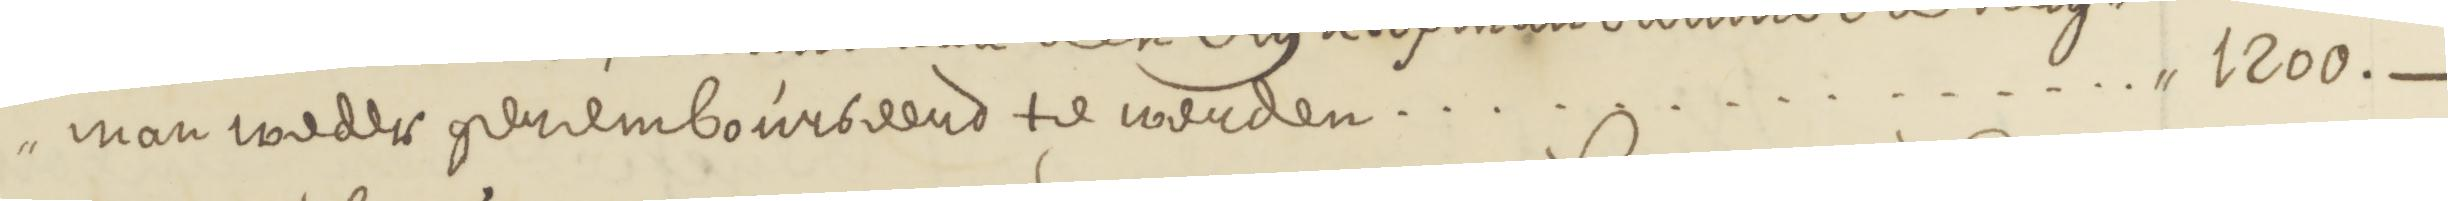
„man weder gerembourseerd te werden . . . . . . . . . . . . . . . . . „ 1200.—
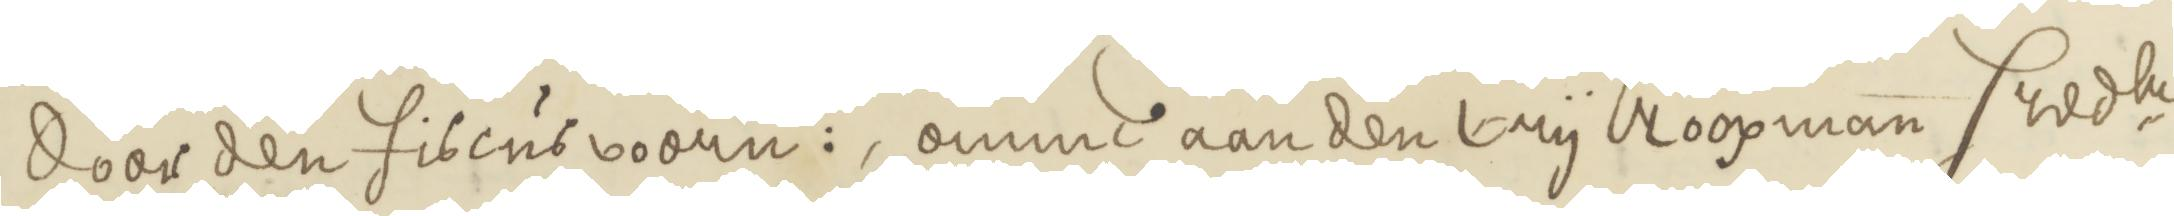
door den fiscus voorn:t, omme aan den vrij Koopman Fred:k
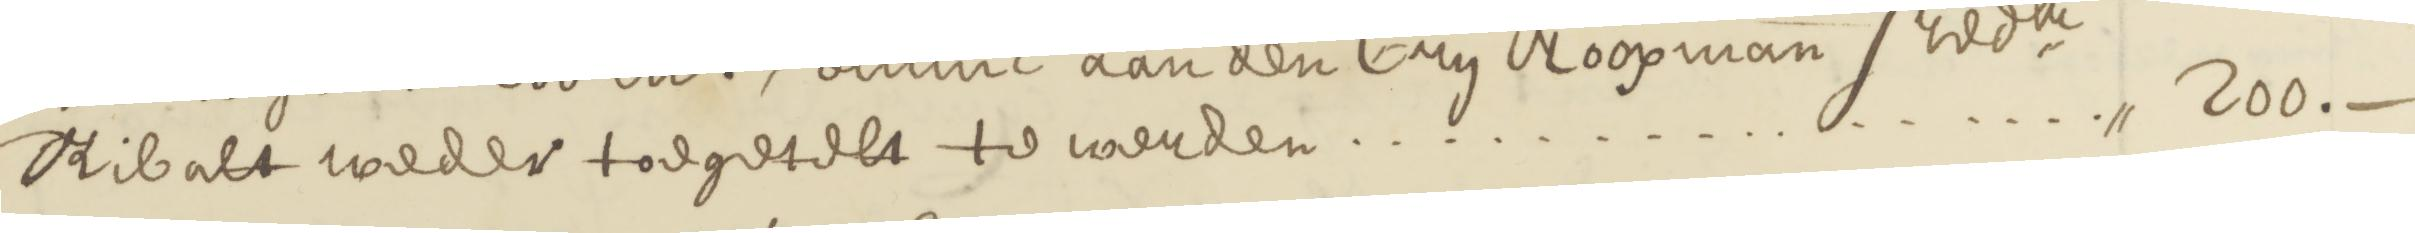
Ribalt weder toegetelt te werden . . . . . . . . . . . . . . . . . . „ 200.—
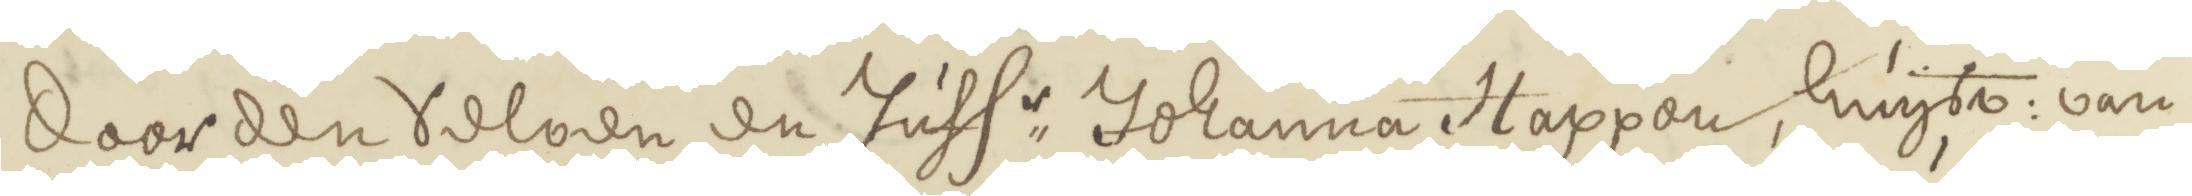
door den Selven en Juff„r Johanna Happon, huijsv: van
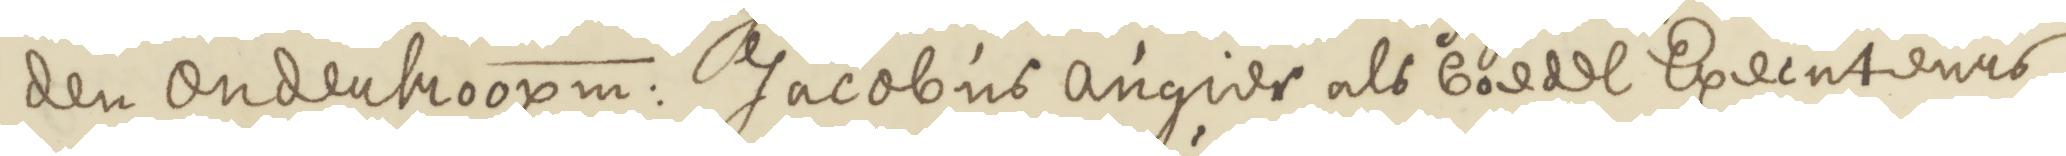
den onderkoopm: Jacobus Augier als boedel Executeurs
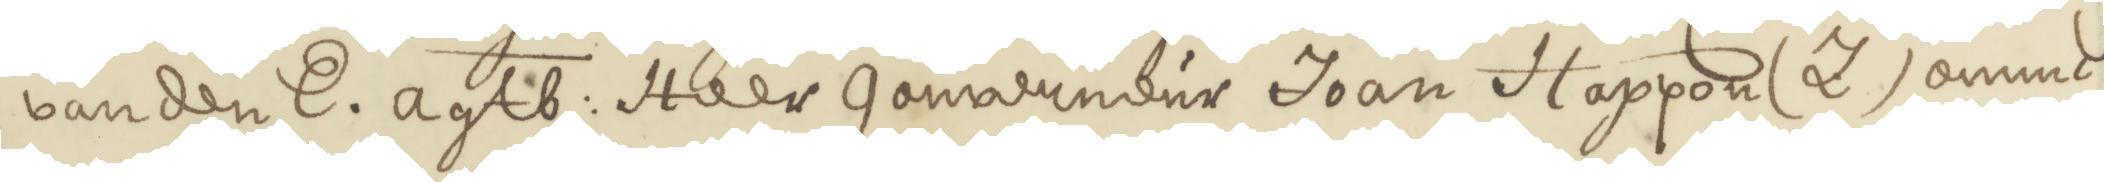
van den E. agtb: Heer gouverneur Ioan Happon (Z) omme
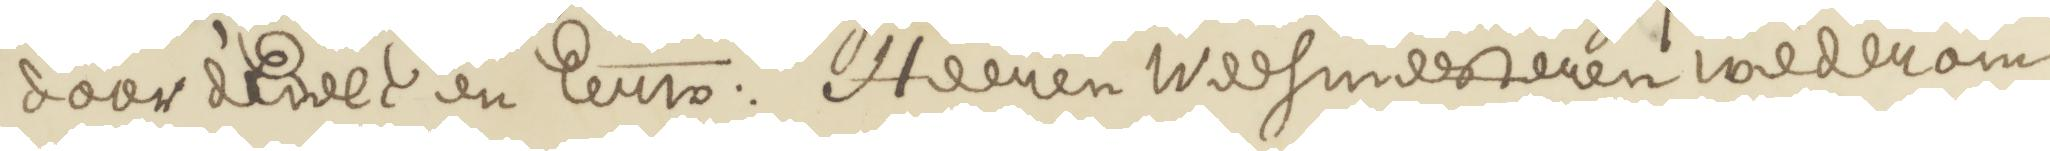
door d'Edele en Eerw: Heeren weesmeesteren wederom
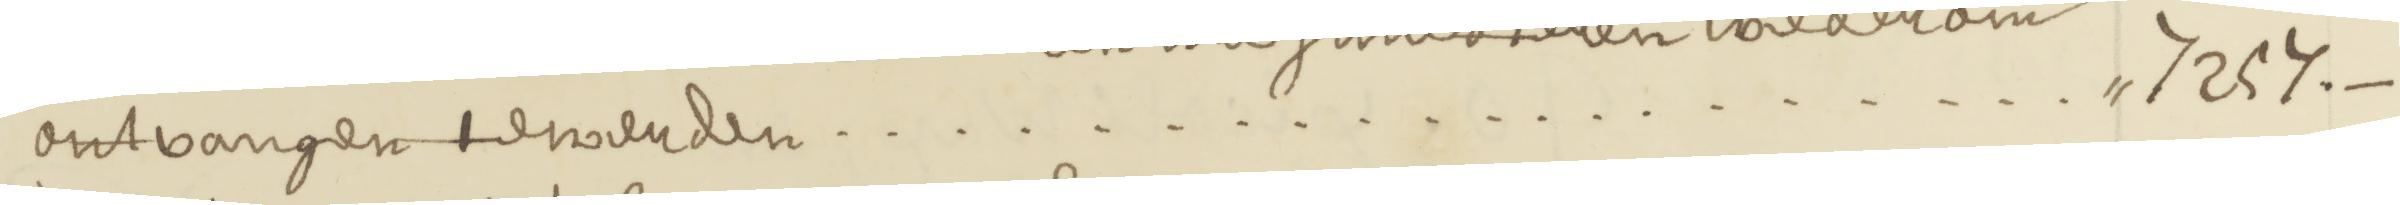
ontvangen te werden. . . . . . . . . . . . . . . . . . . . . „7257.—
